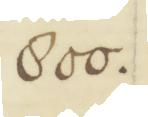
800.
